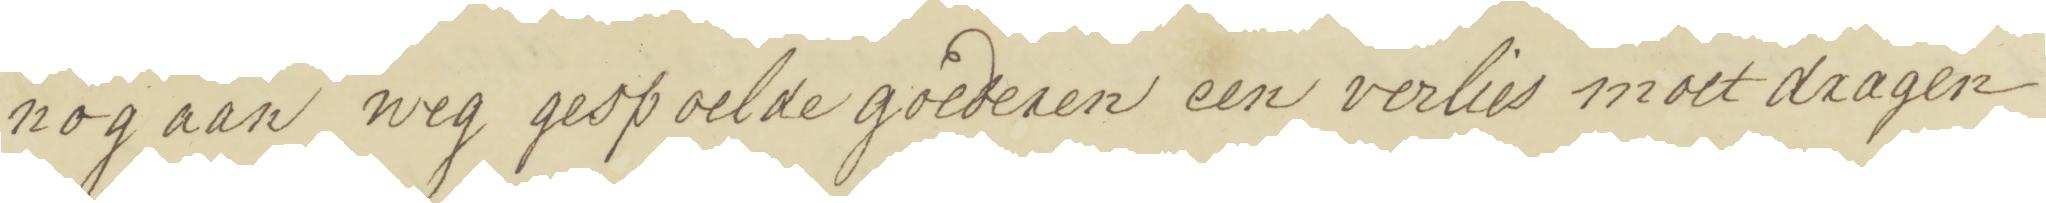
nog aan weg gespoelde goederen een verlies moet dragen
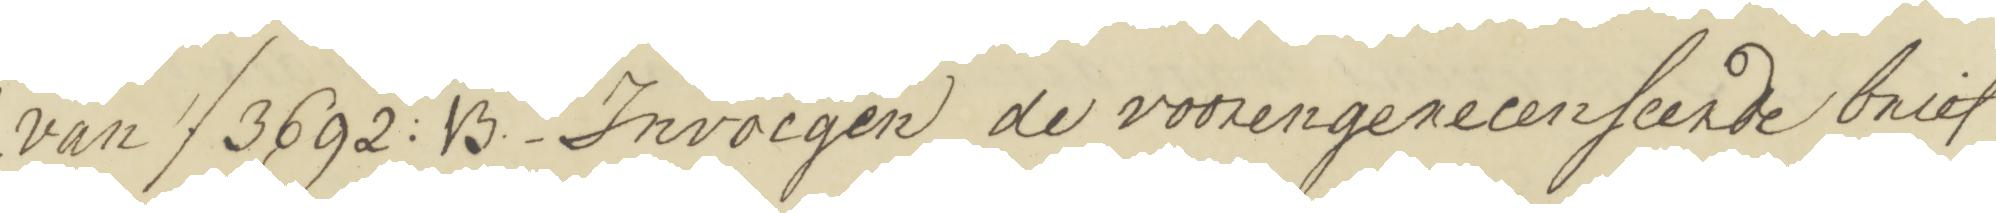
van ƒ 3692:13.- Invoegen de voorengerecenseerde brief
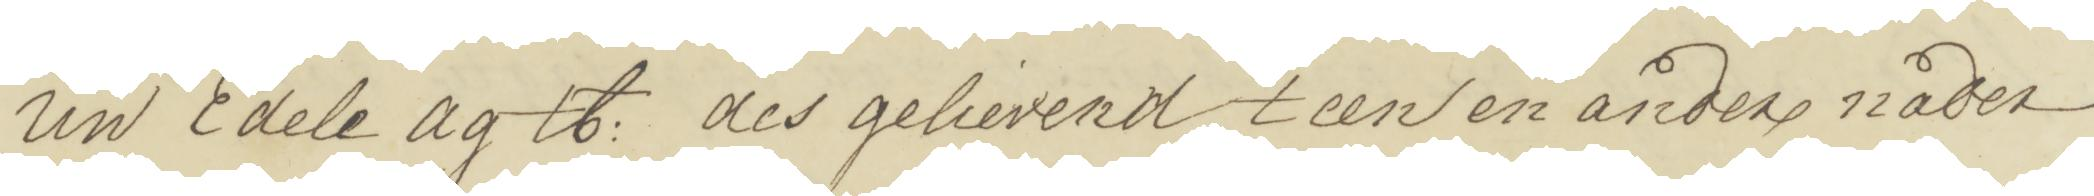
uw Edele agtb: des gelievend 't een en ander nader
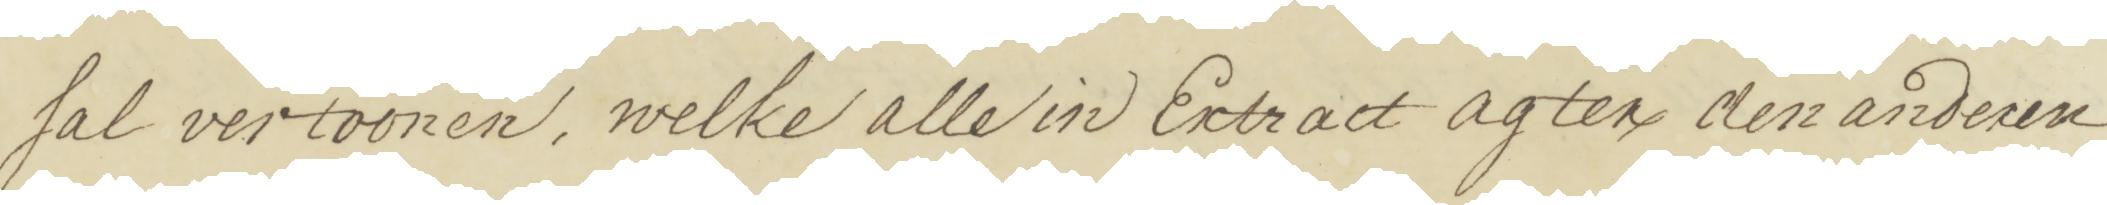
sal vertoonen, welke alle in Extract agter den anderen
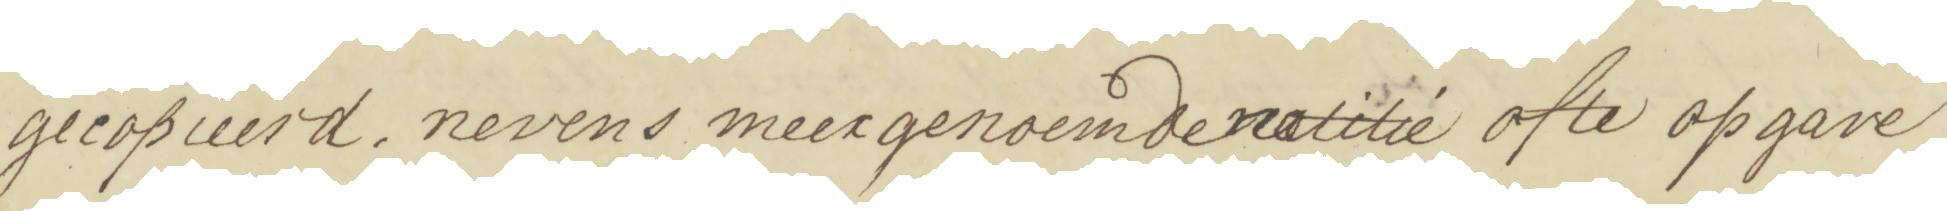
gecopieerd, nevens meergenoemde notitie ofte opgave
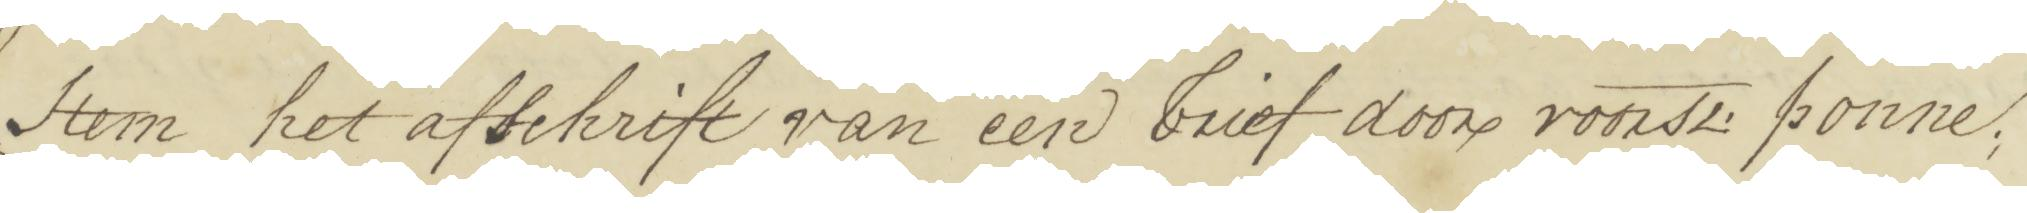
Item het afschrift van een brief door voorsz: ponne;
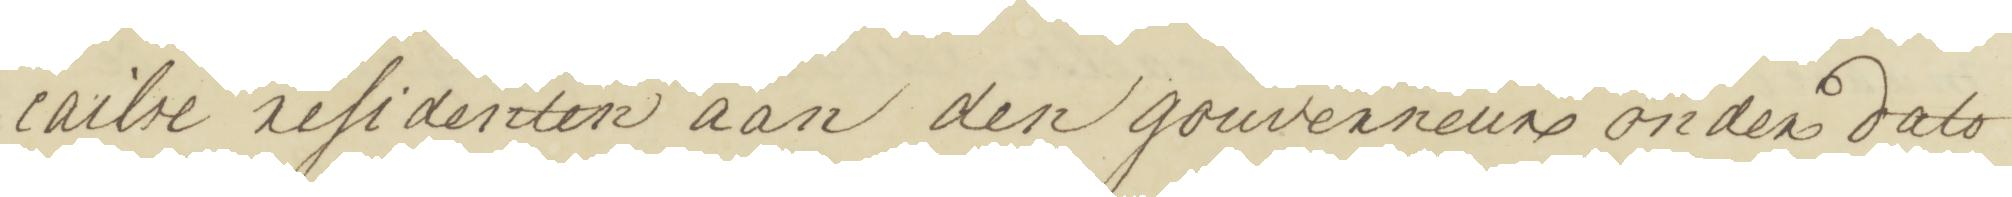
cailse residenten aan den gouverneur onder dato
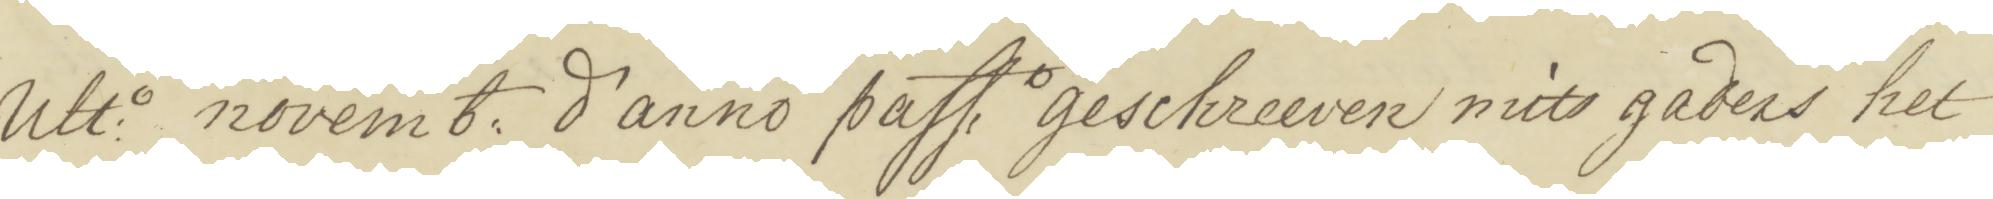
ult:o novemb: d’anno pass:o geschreeven mits gaders het
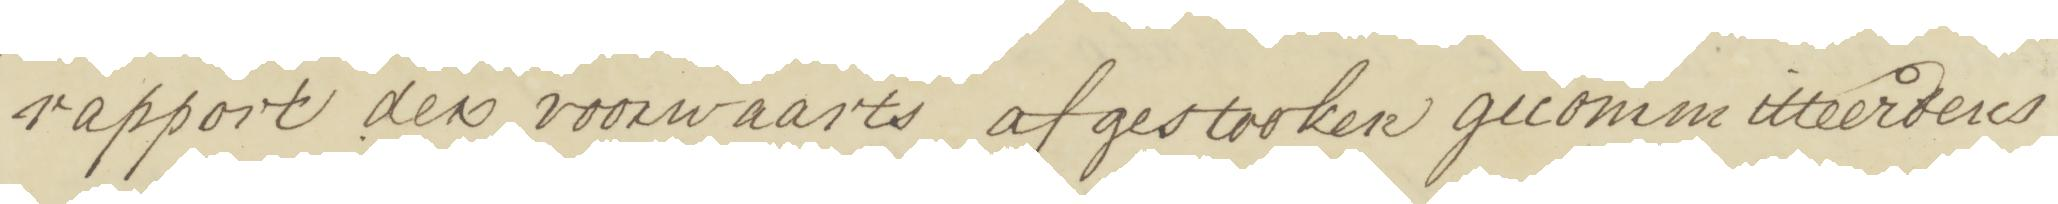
rapport der voorwaarts afgestooken gecommitteerdens
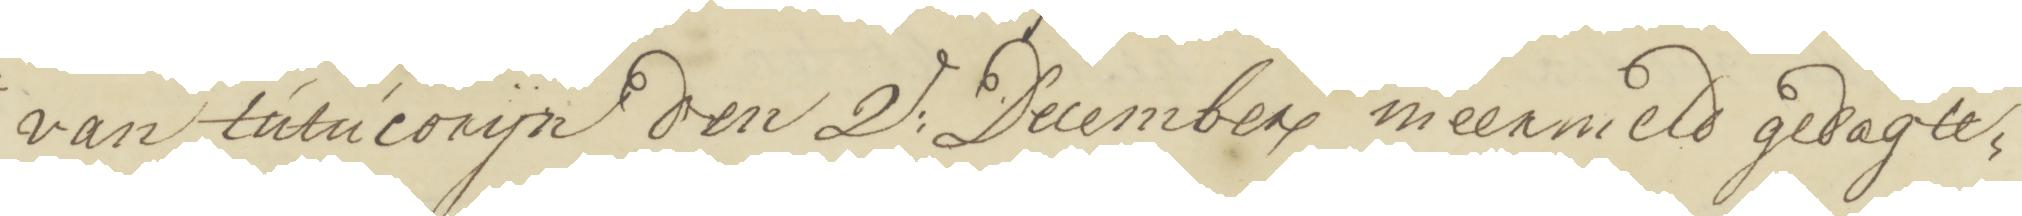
van tutucorijn den 2: December meermeld gedagte„
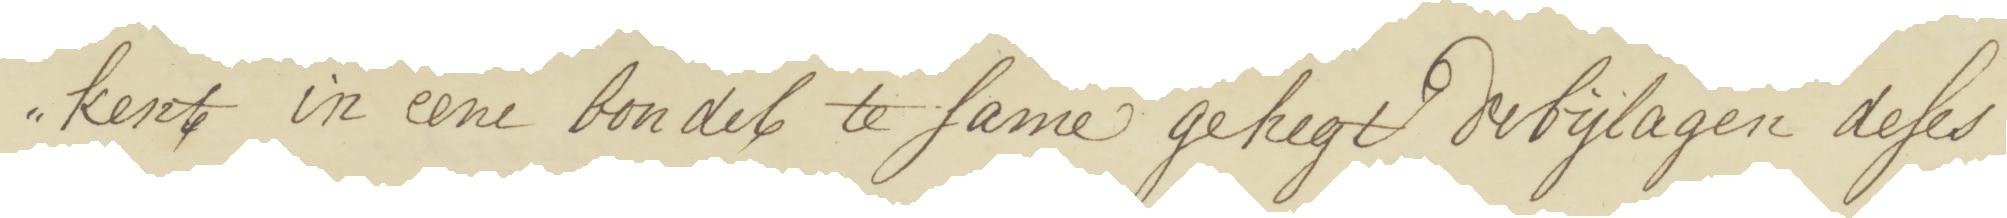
„kent in eene bondel te same gehegt de bijlagen deses
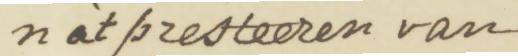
na't presteeren van
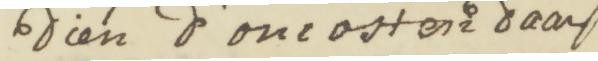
dien d’ oncosten daar
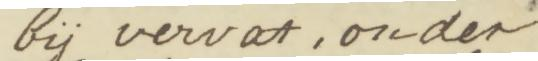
bij vervat, onder
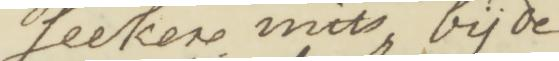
seeker mits, bij de
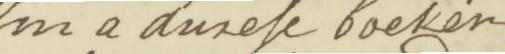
madurese boeken
